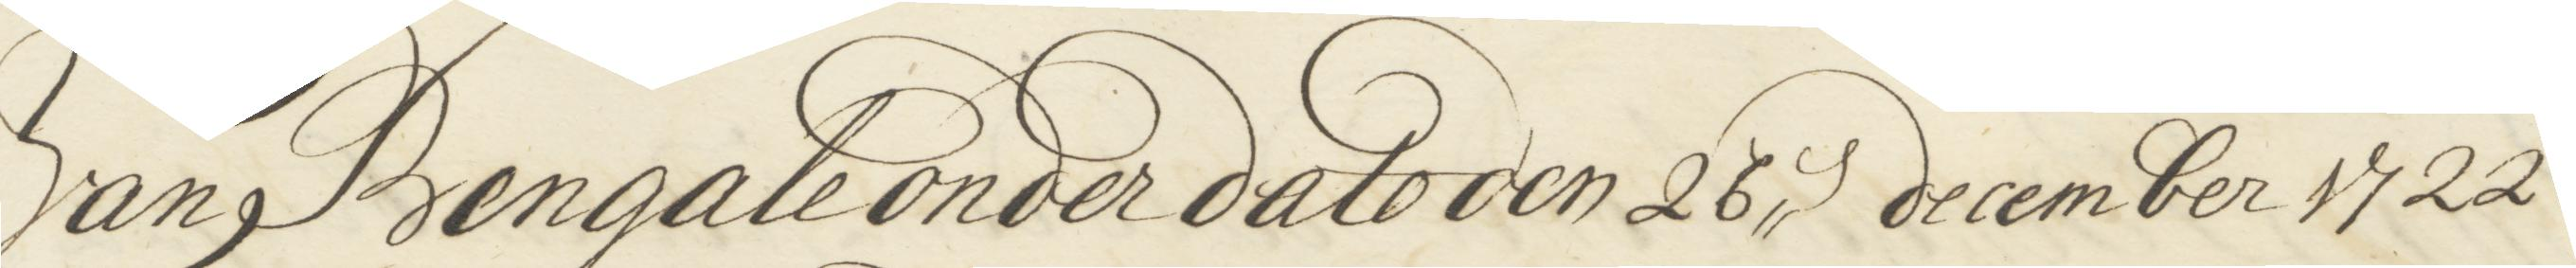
Van Bengale onder dato den 26„en december 1722
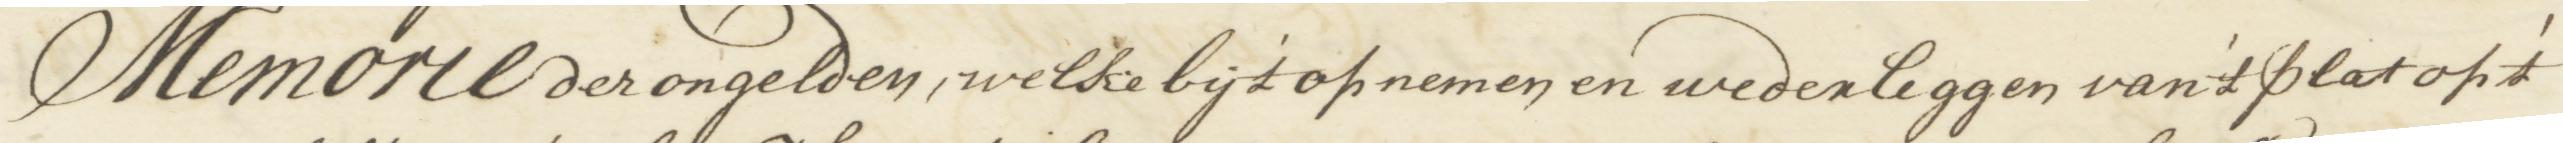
Memorie der ongelden, welke bij't opnemen en wederleggen van't plat op't
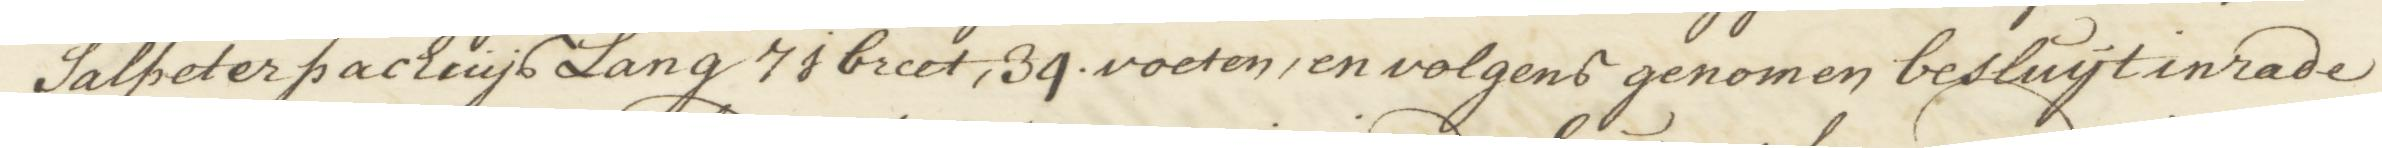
salpeterpachuijs Lang 71 breet, 34. voeten, en volgens genomen besluijt inrade
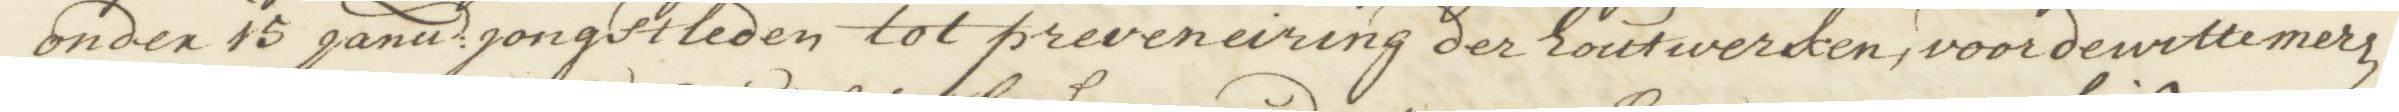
onder 15 ganu: jongstleden tot preveneiring der houtwerken, voor de witte meren
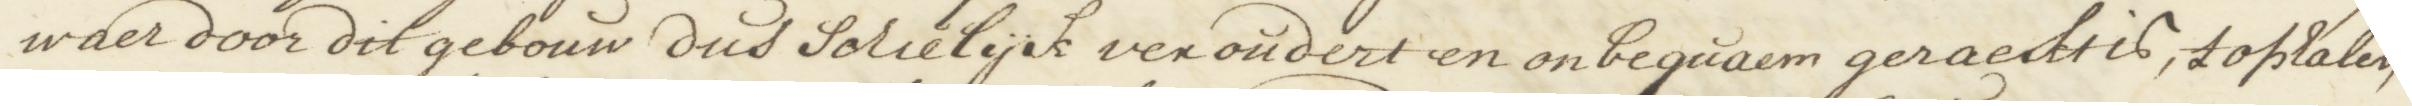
waer door dit gebouw dus schielijk veroudert en onbequaem geraekt is, t ophalen
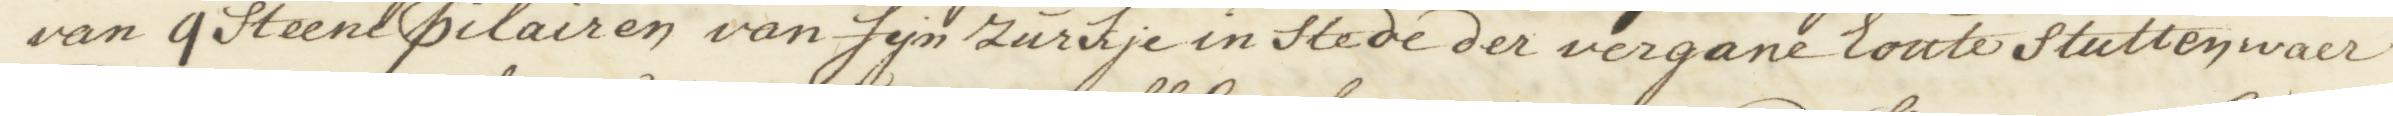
van 4 steene pilairen van sijn zurkje in stede der vergane houte stutten waer
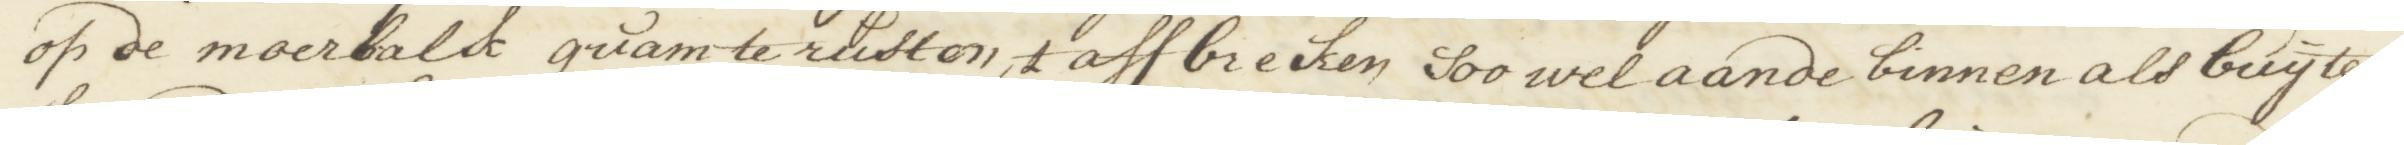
op de moerbalk quam te rusten, t affbrecken soo wel aande binnen als buijten
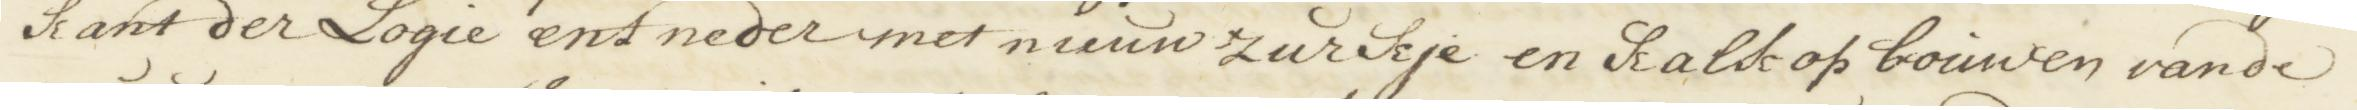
kant der Logie ent neder met nieuw zurkje en kalk op bouwen van de
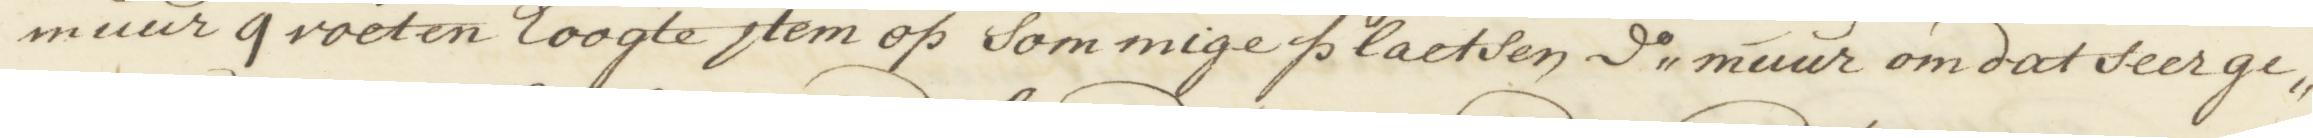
muur 4 voeten hoogte jtem op sommige plaetsen d„o muur om dat seer ge„
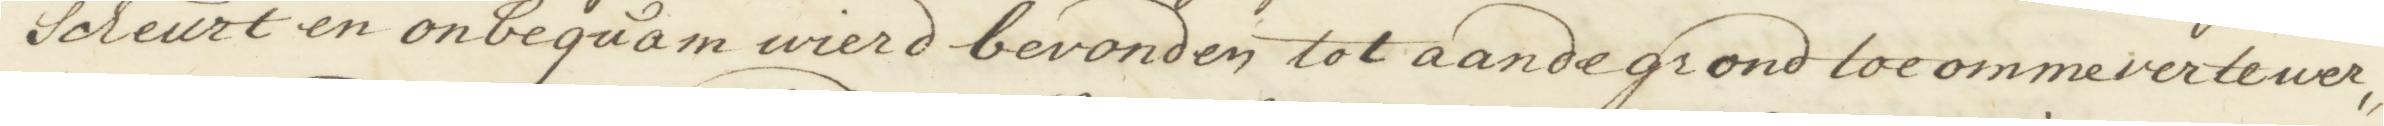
scheurt en onbequam wierd bevonden tot aande grond toe ommever te wer„
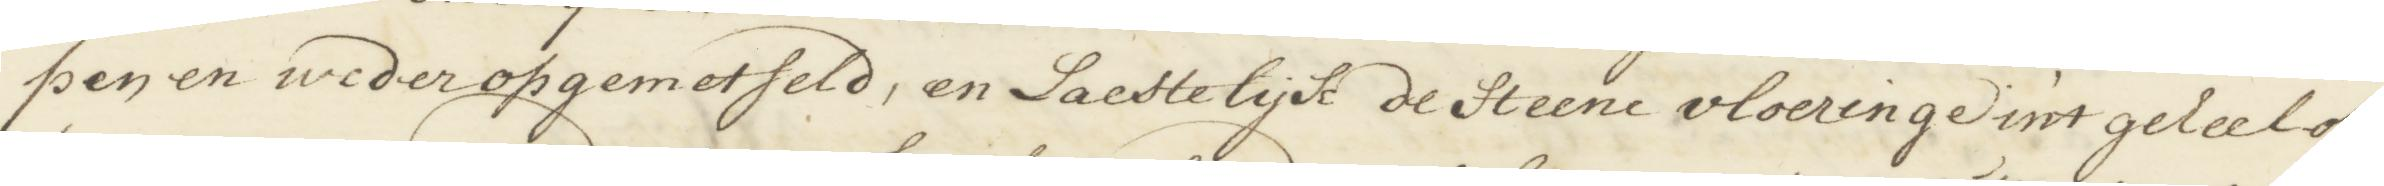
pen en weder opgemetseld, en Laestelijk de steene vloeringe in't geheel op
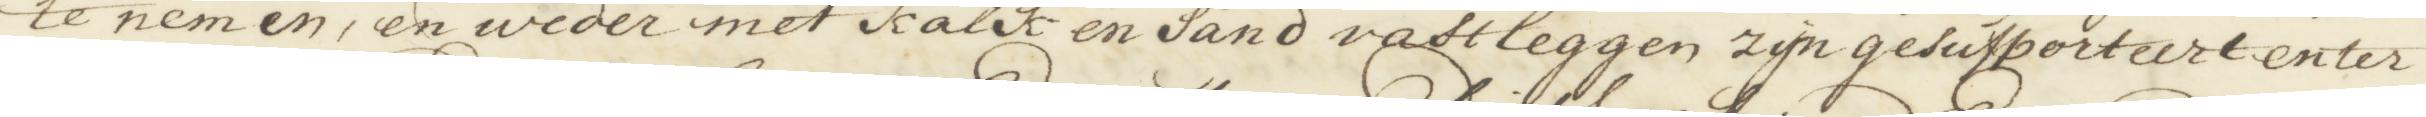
te nemen, en weder met kalck en sand vastleggen zijn gesupporteert en ter
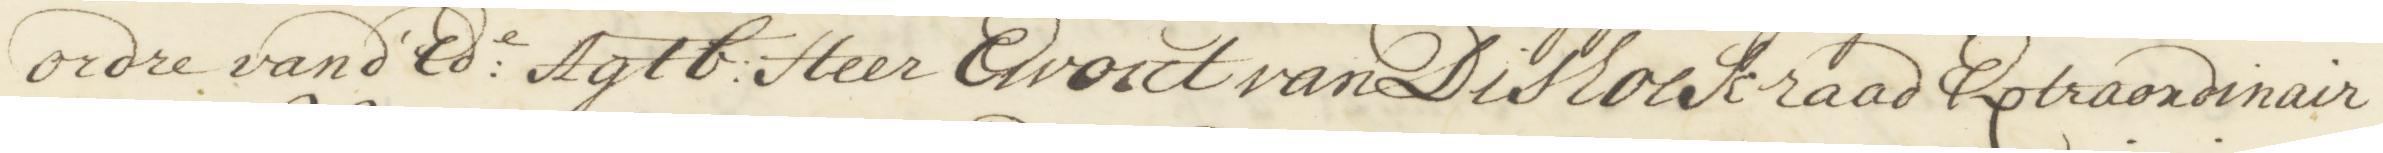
ordre van d’ Ed:e Agtb Heer Ewout van Dishoek raad Extraordinair
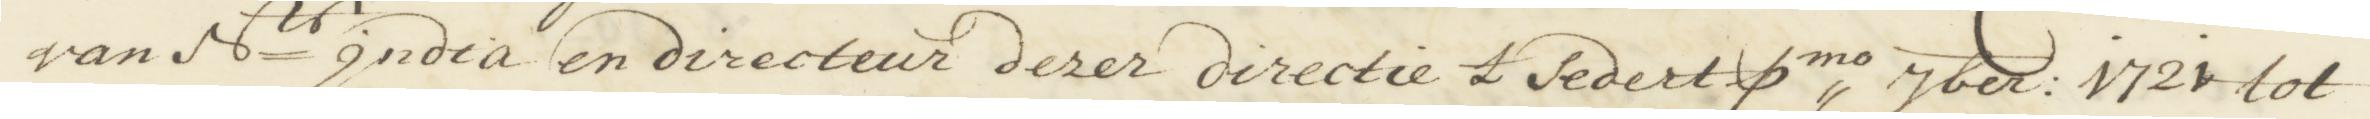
van N=s jndia en directeur dezer directie 't sedert p„mo 7ber: 1721 tot
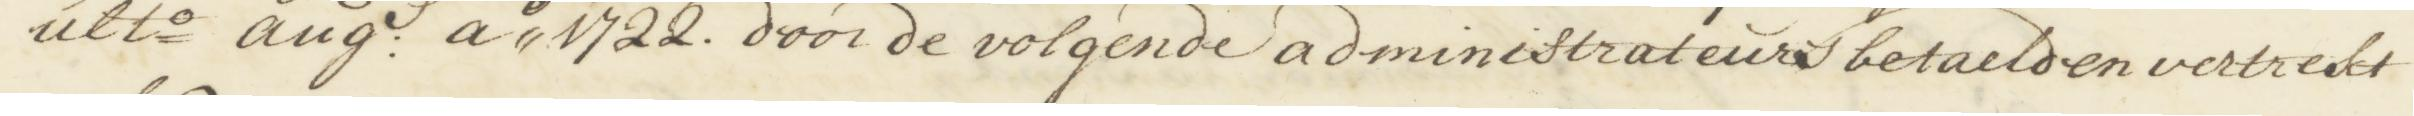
ult=o aug:s a„o 1722. door de volgende administrateurs betaeld en vertrekt
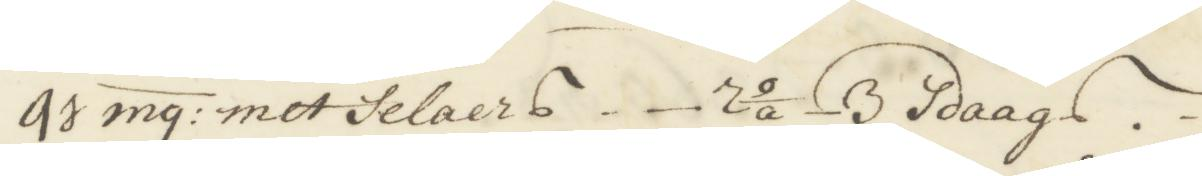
48 mq: metselaers - — ro/a 3 sdaags.
